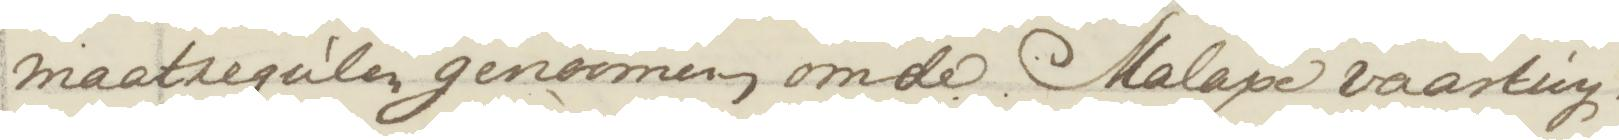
maatregulen genoomen om de Malaxe vaartuy.
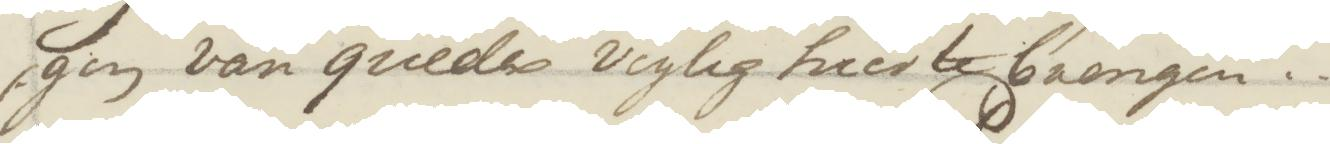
„gen van ginder veylig hier te brengen.
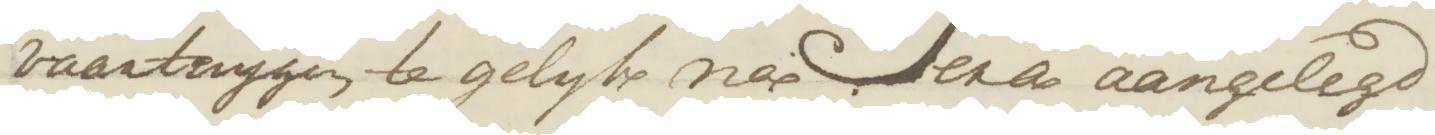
vaartuygen te gelyk na Pera aangelegd
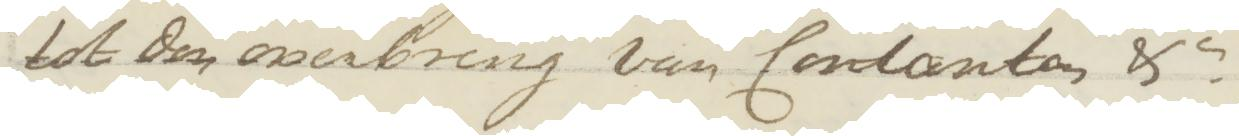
tot den overbreng van Contanten &=a
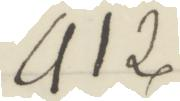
412
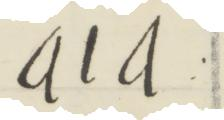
414 :
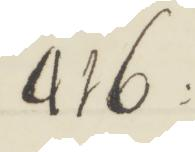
416 :
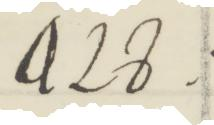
428 :
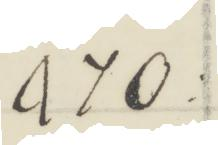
470 :
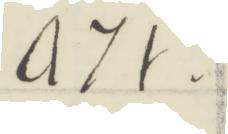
471 :
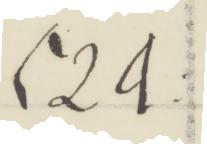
524 :
